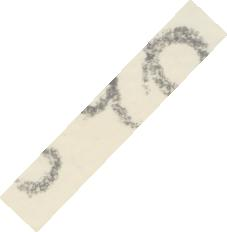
346
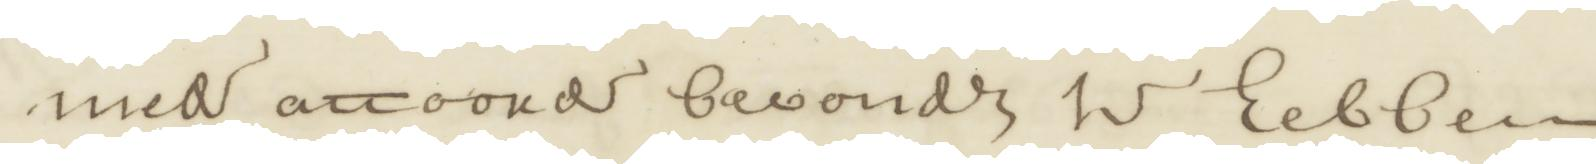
mede accoorde bevonden te hebben
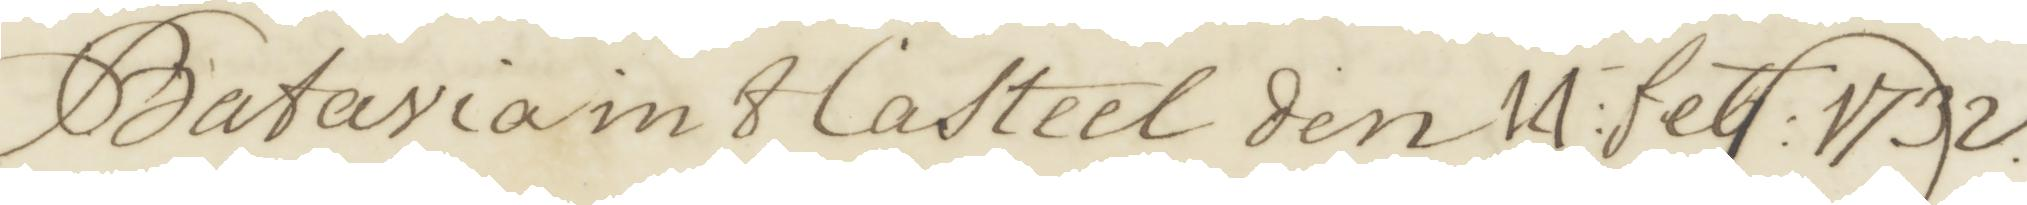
Batavia in ’t Casteel den 14:' feb: 1732
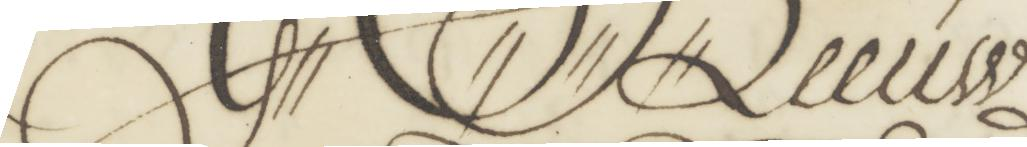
G„s E„t „ S„ Leeuw
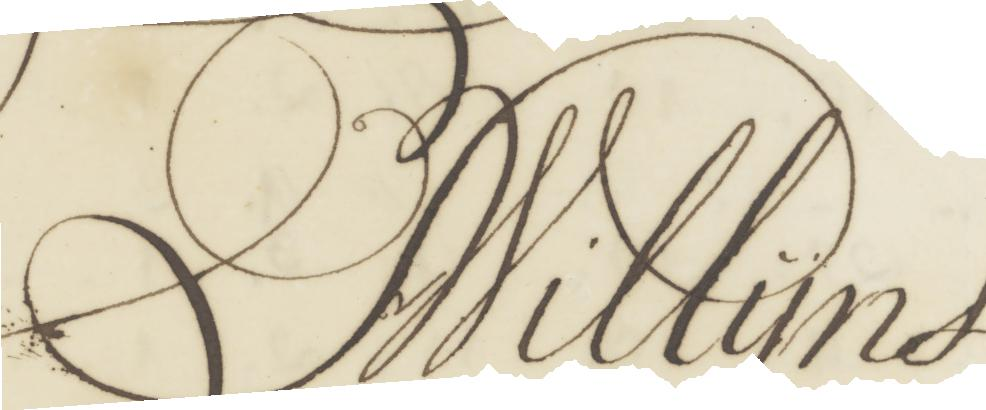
AWillijns
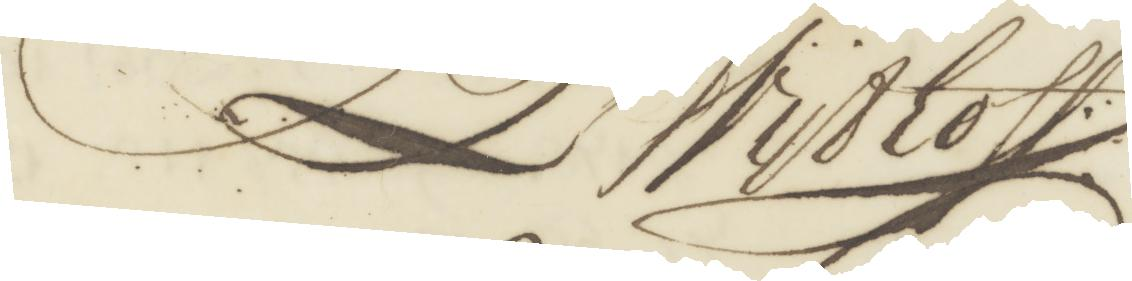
L„r Wijthoff
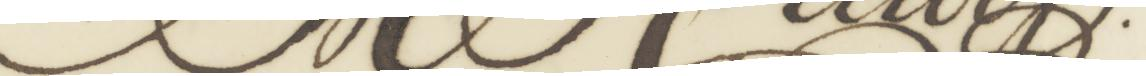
H„kP„sCrudop
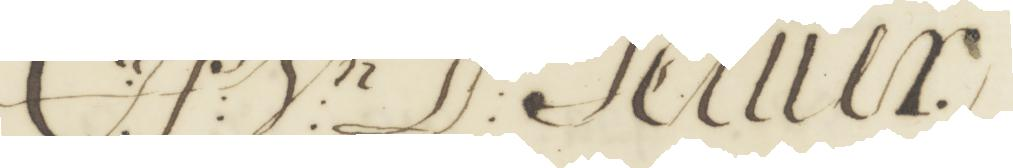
E:d J:s V:n D:r Schuer.
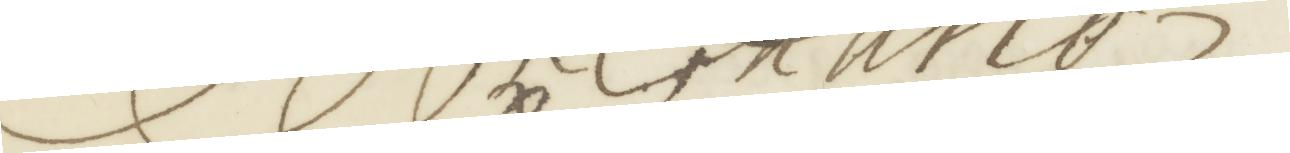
I„n le Grand
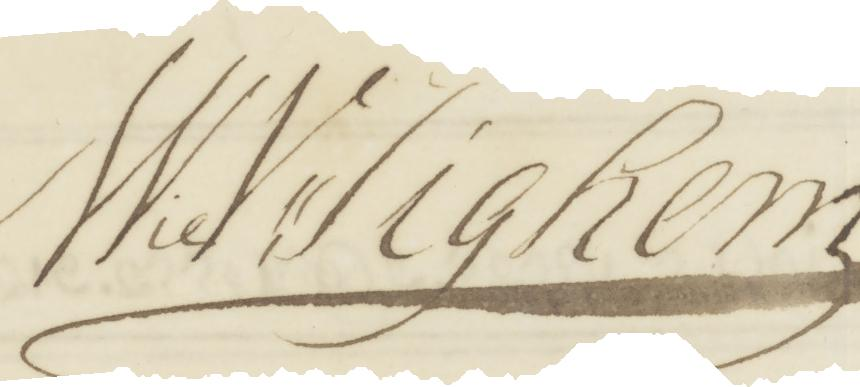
Wil V,„ Tighem
